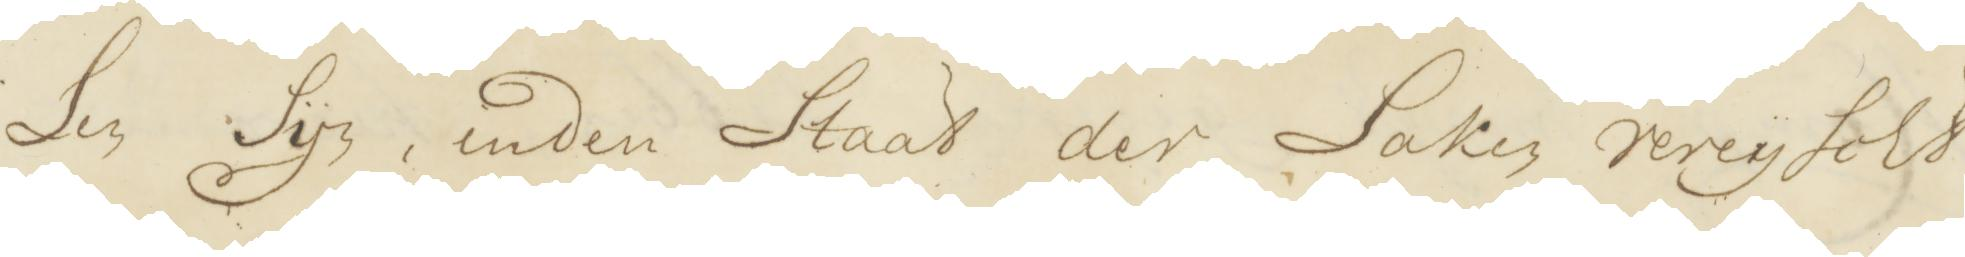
len sijn, inden staat der saken vereijscht
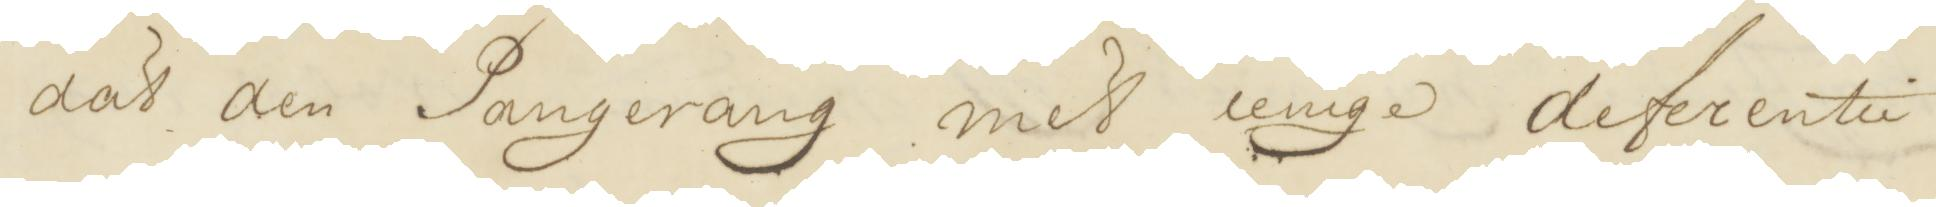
dat den Pangerang met eenige deferentie
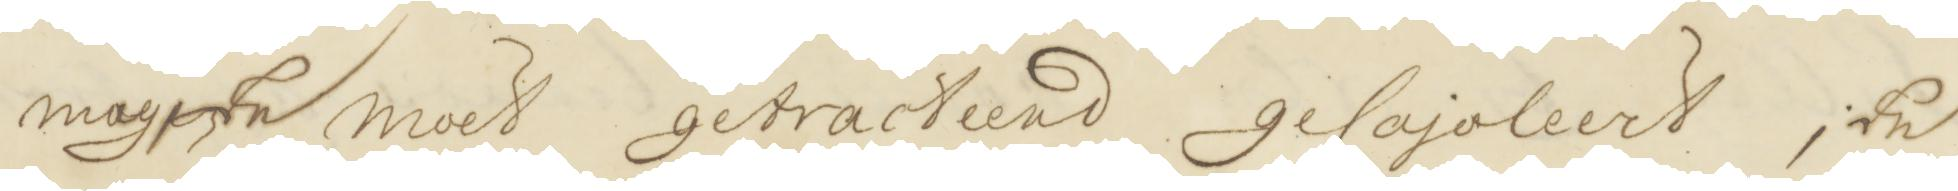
mag, En moet getracteerd gecajoleert; En
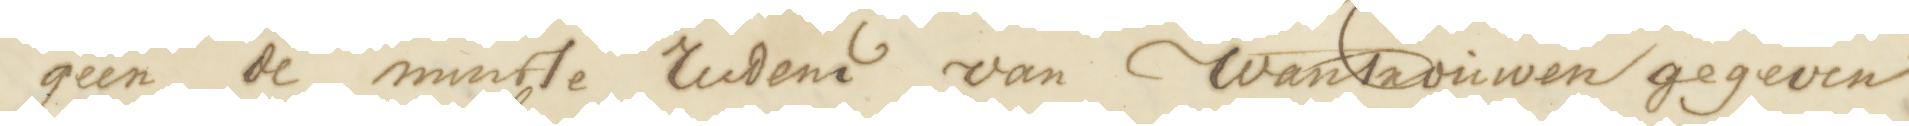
geen de minste reedene van wantrouwen gegeven
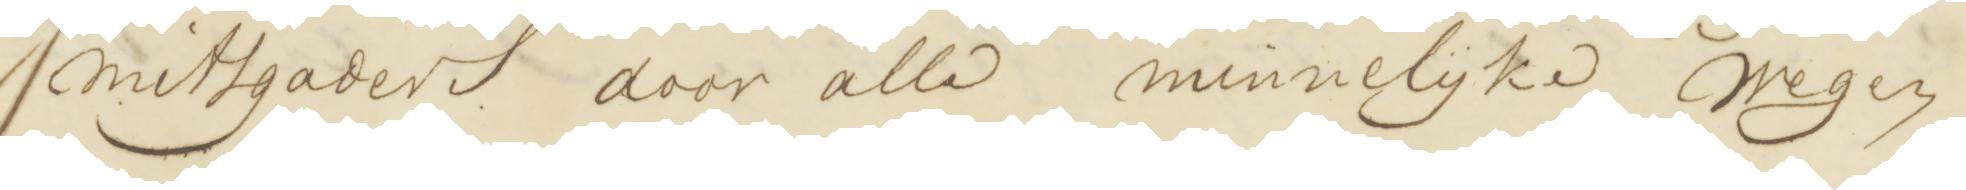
mitsgaders door alle minnelijke wegen
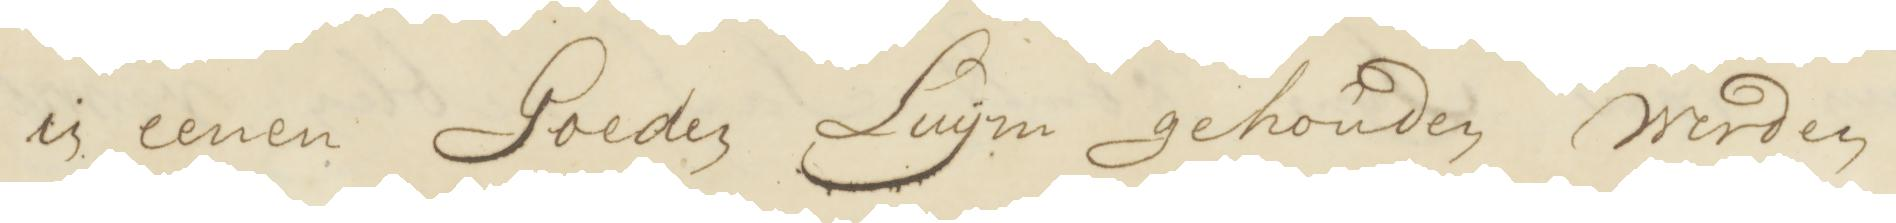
in eenen Goeden Luijm gehouden werden
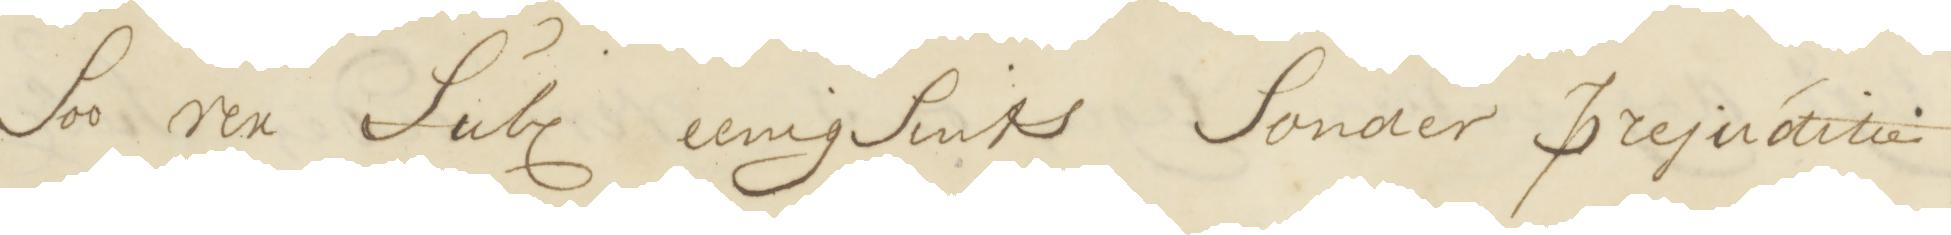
soo ver sulx eenigsints sonder prejuditie
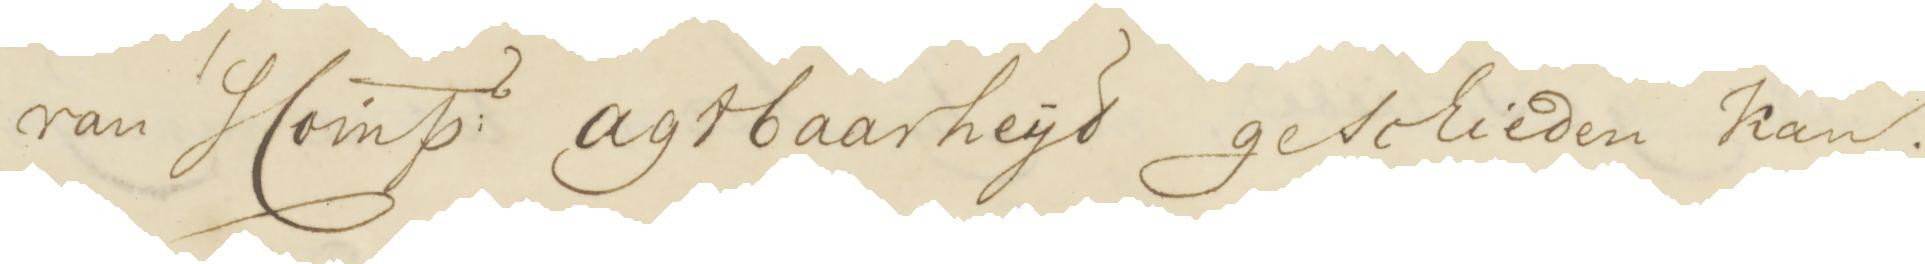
van 'sComp:s agtbaarheijd geschieden kan
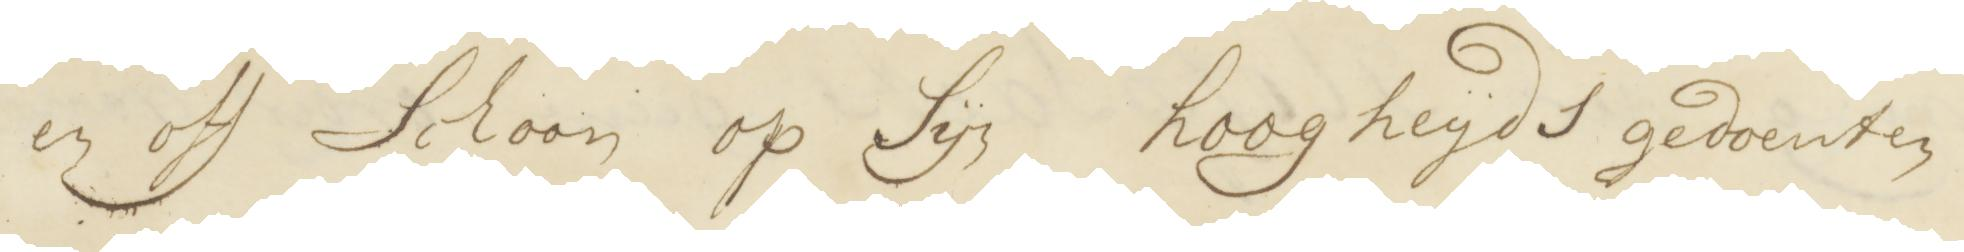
en off schoon op sijn hoogheijds gedoenten
